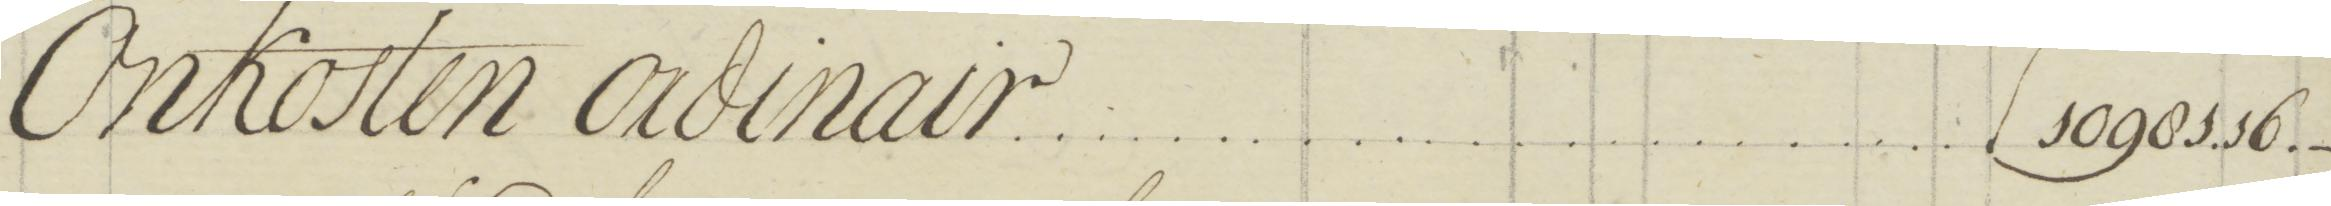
Onkosten ordinair . . . . . . . . . . . . . . . . . . . . . . . ƒ 10981.16.–
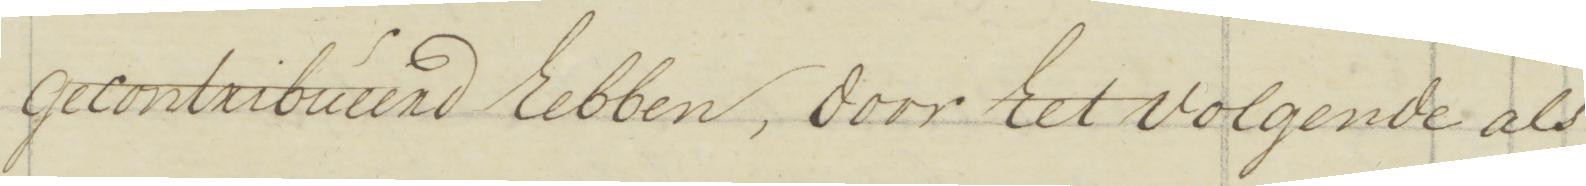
gecontribueerd hebben, door het volgende als
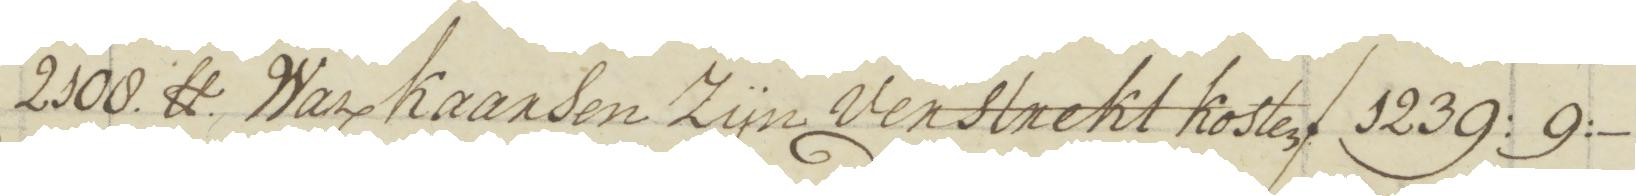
2100. lb. Wax kaarsen zijn verstrekt kosten ƒ 1239: 9:–
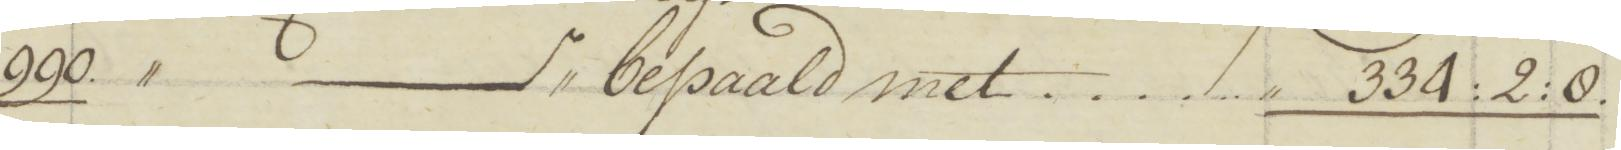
990. „ _„o bepaald met . . . . . . „ 334: 2: 8.
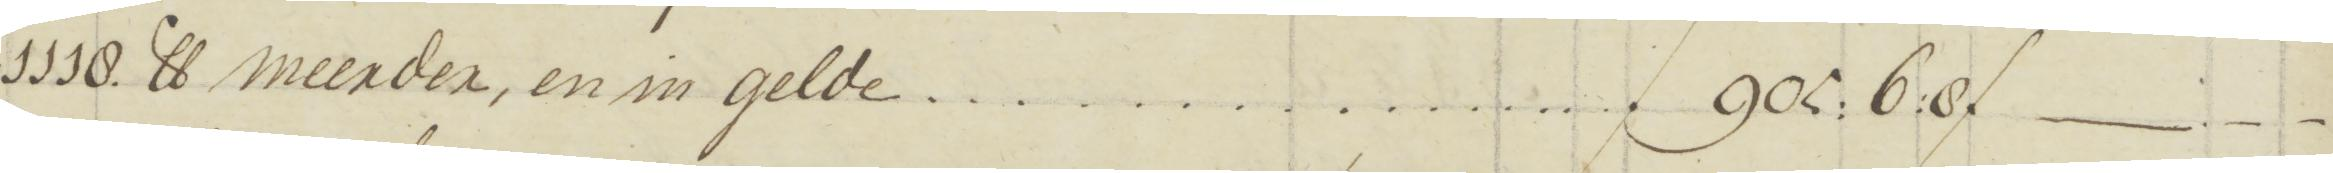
1118. lb meerder, en in gelde . . . . . . . . . . . . . . . . ƒ 905: 6: 8ƒ — . – –
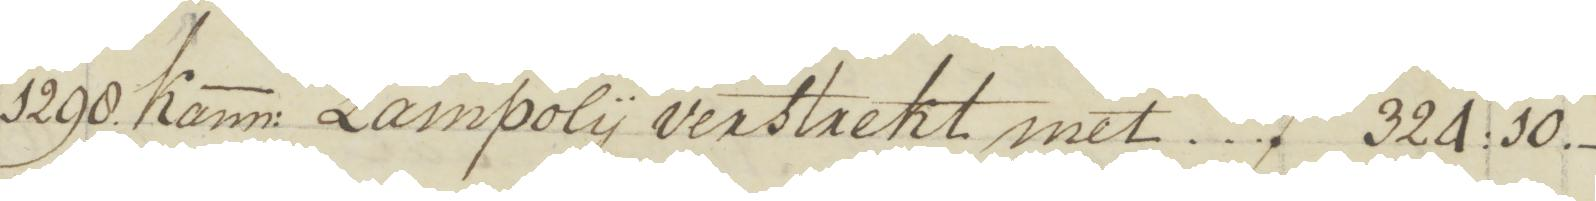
1298. kann: Lampolij verstrekt met . . .ƒ 324: 10.
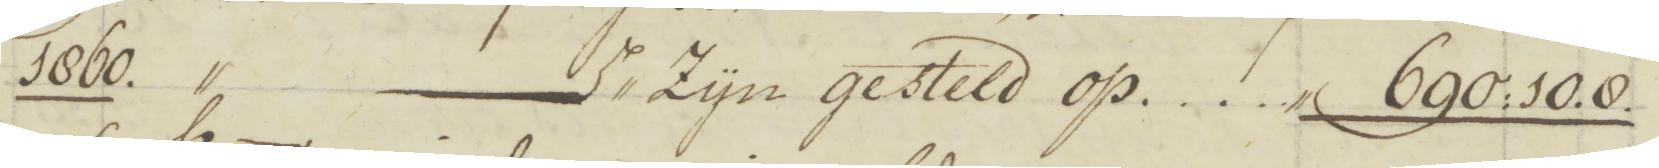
1860. „ _„o zijn gesteld op. . . . .„ 690:10.8.
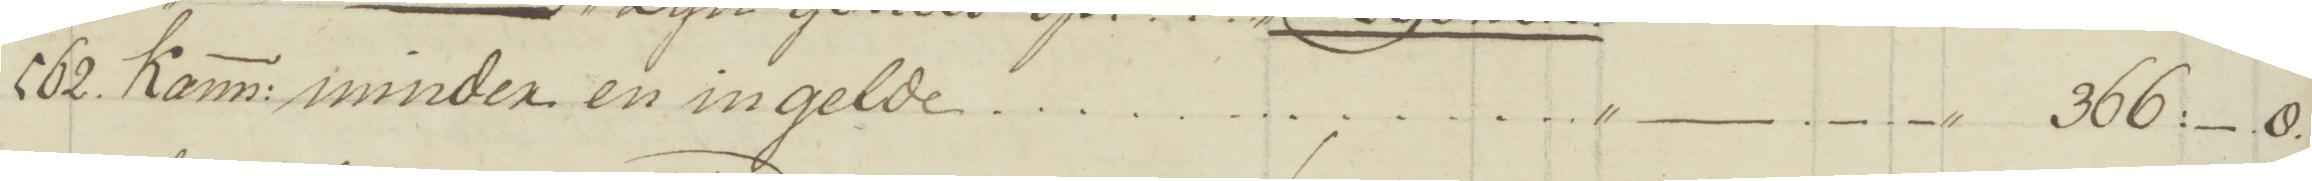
562. kann: minder en in gelde . . . . . . . . . . . . . . „ — . – . – „ 366: — . 8
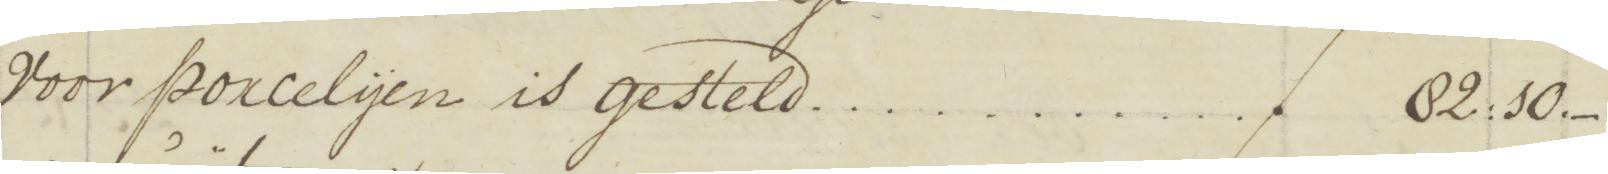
Voor porcelijen is gesteld . . . . . . . . . . . ƒ 82:10.–
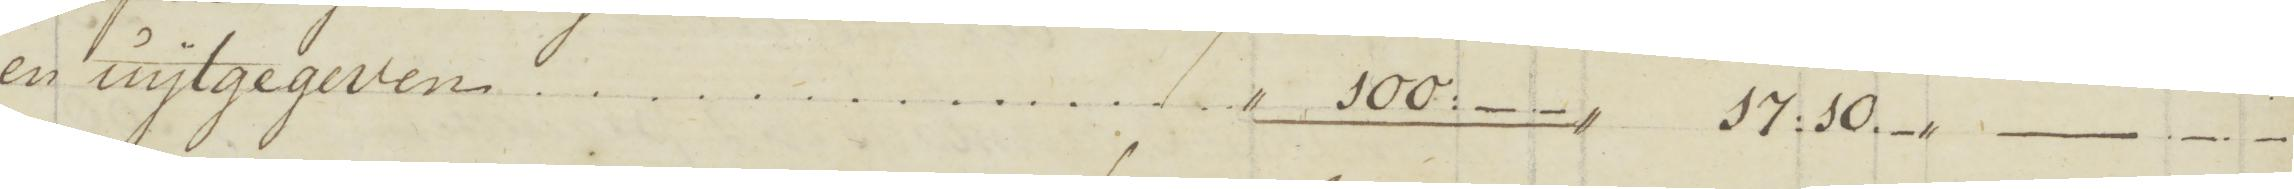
en uijtgegeven . . . . . . . . . . . . . . . . „ 100: – . – „ 17:10.–„ — . – . –
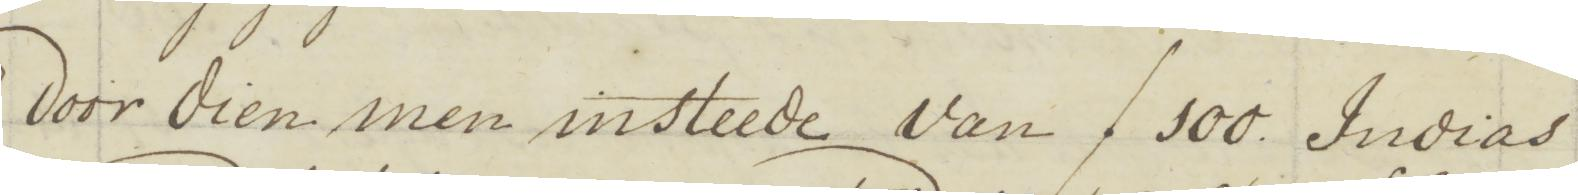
door dien men insteede van ƒ 100. Indias
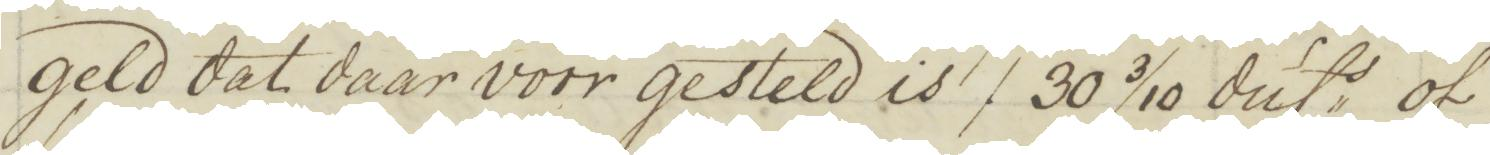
geld dat daar voor gesteld is ƒ 30 3/10 duc„s of
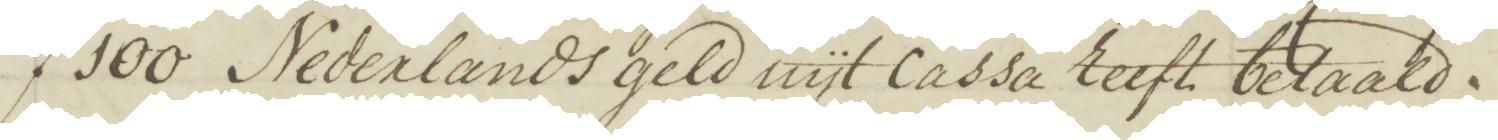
ƒ 100 Nederlands geld uijt cassa heeft betaald .
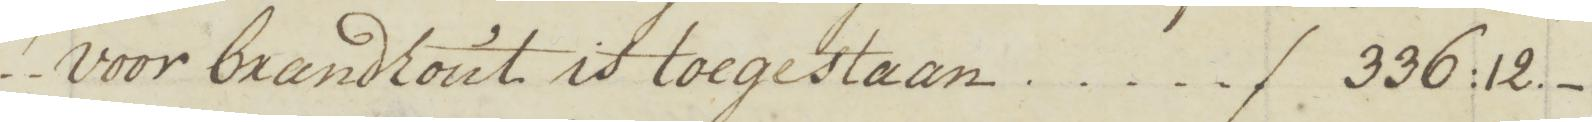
- - voor brandhout is toegestaan . . . . . ƒ 336:12.–
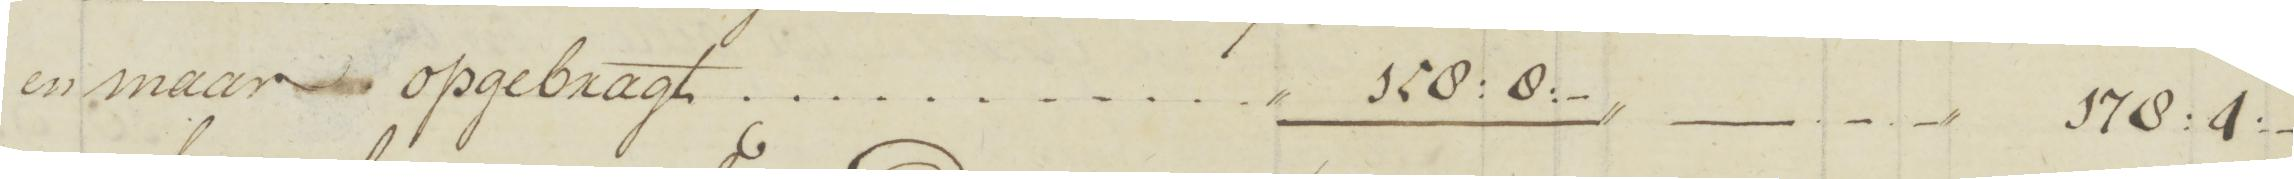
en maar opgebragt . . . . . . . - . . . „ 158: 8:– „ — . – . –„ 178: 4:
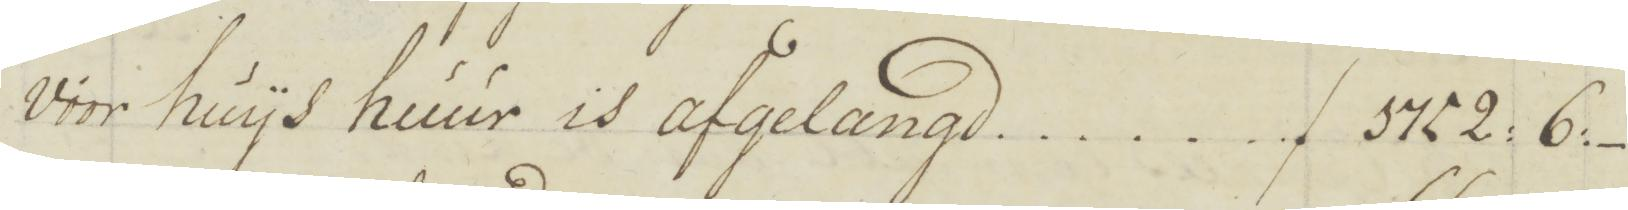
voor huijs huur is afgelangd . . . . . . .ƒ 1752: 6:–
